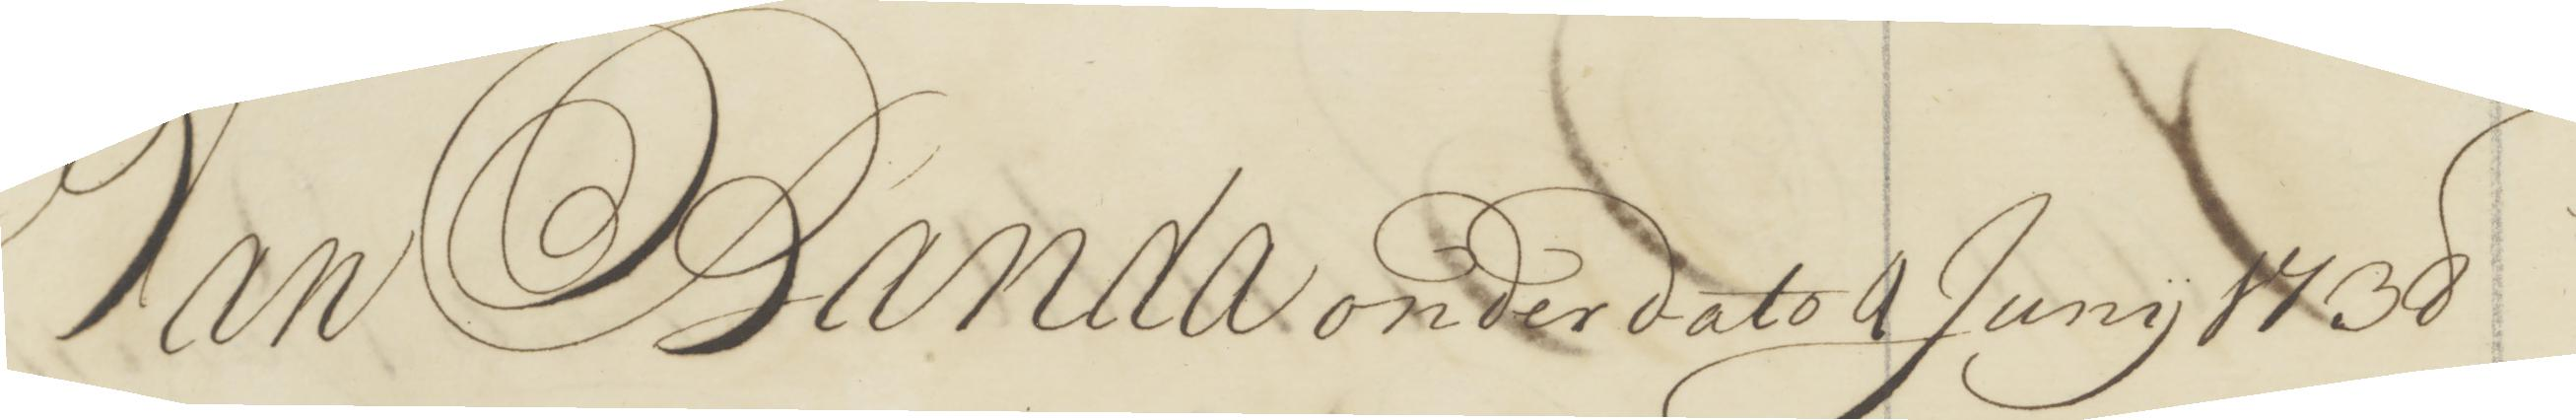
Van Banda onder dato 4 Junij 1738
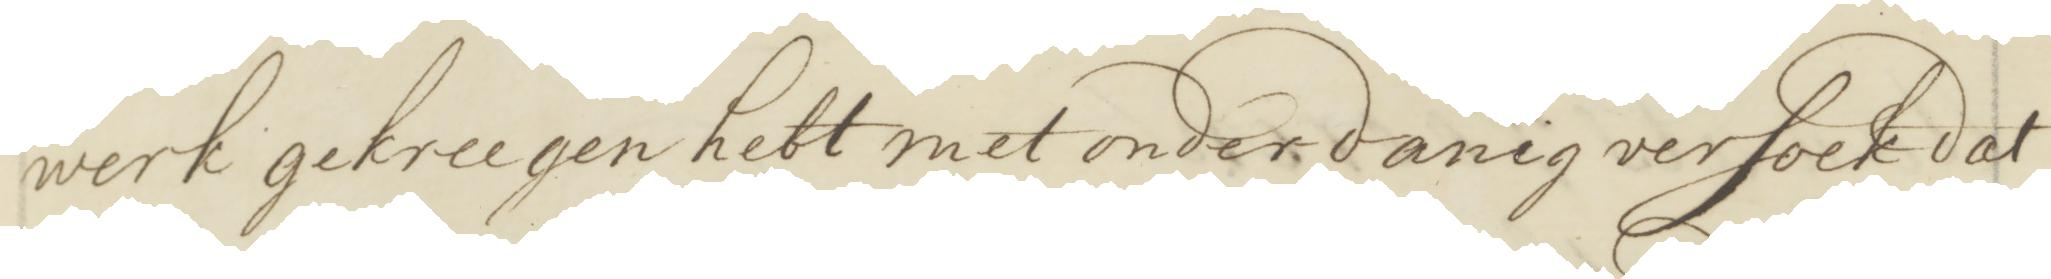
werk gekreegen hebt met onderdanig versoek dat
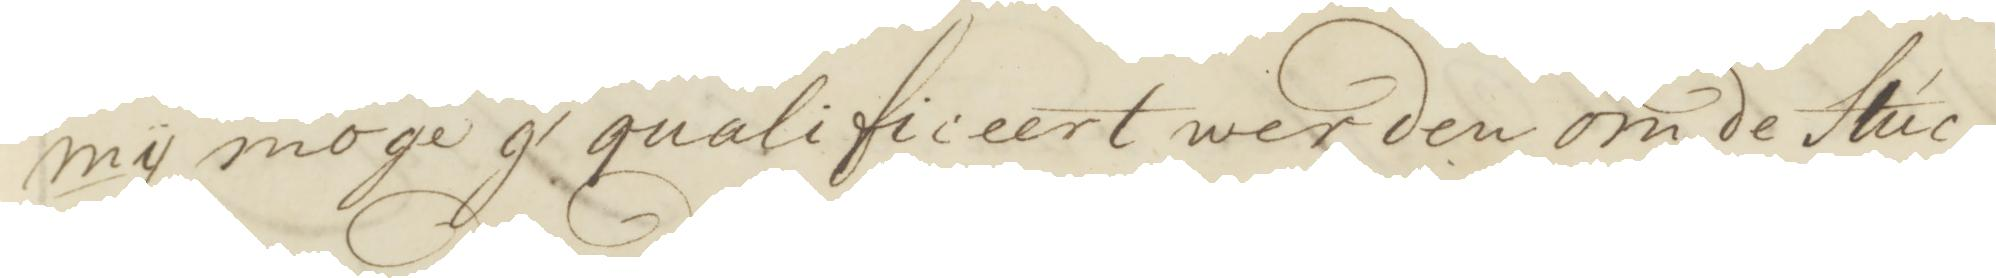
mij moge g' qualificeert werden om de stuc
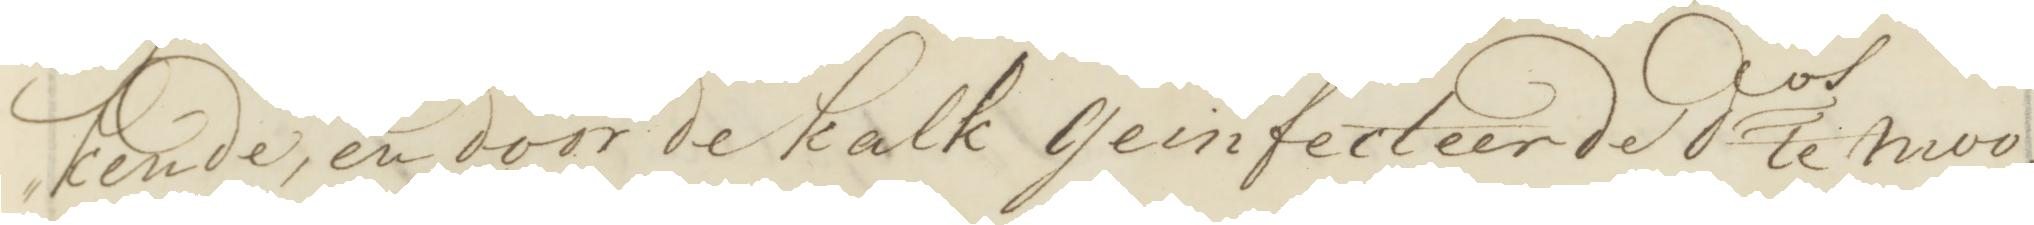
„kende, en door de kalk geinfecteerde d=os te moo
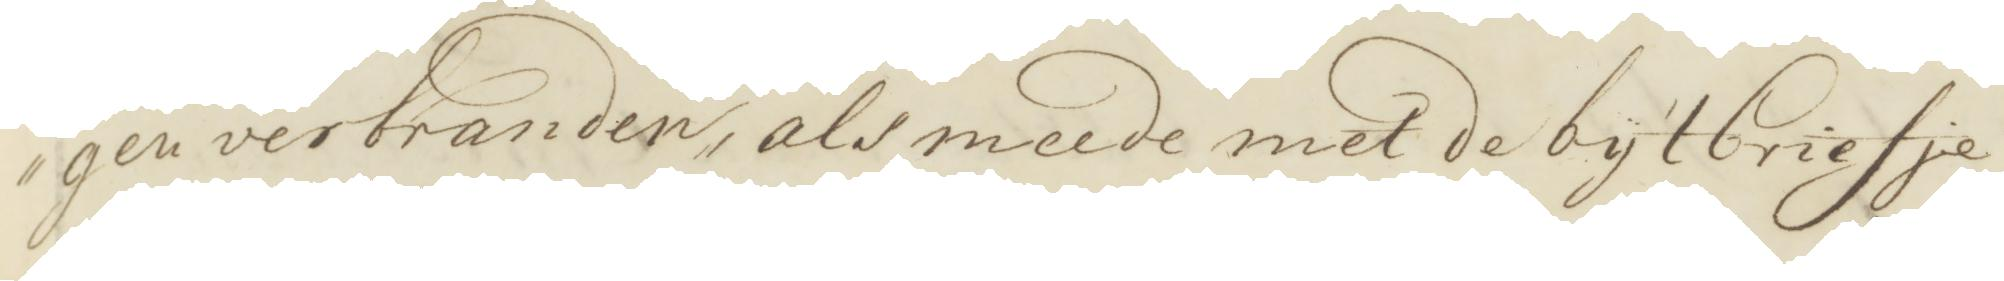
„gen verbranden, als meede met de bij 't briefje
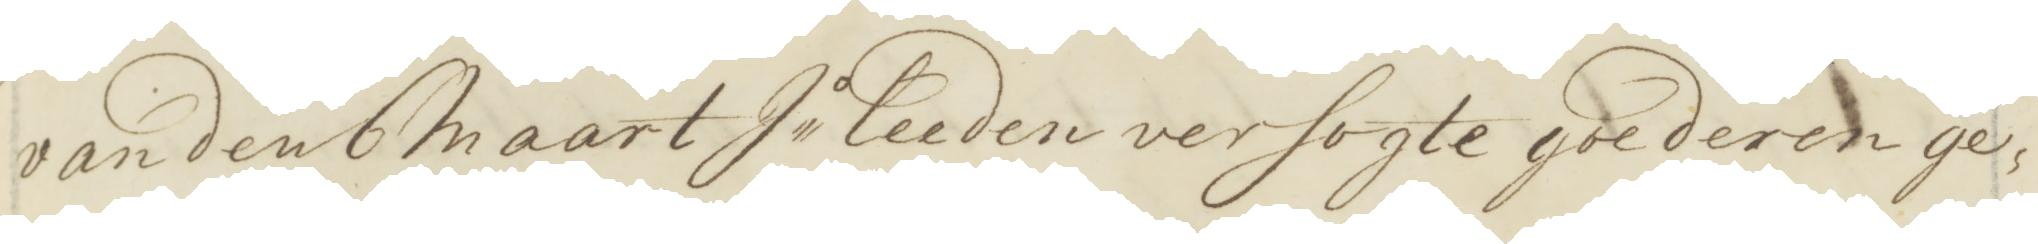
van den 6 Maart J„o leeden versogte goederen ge„
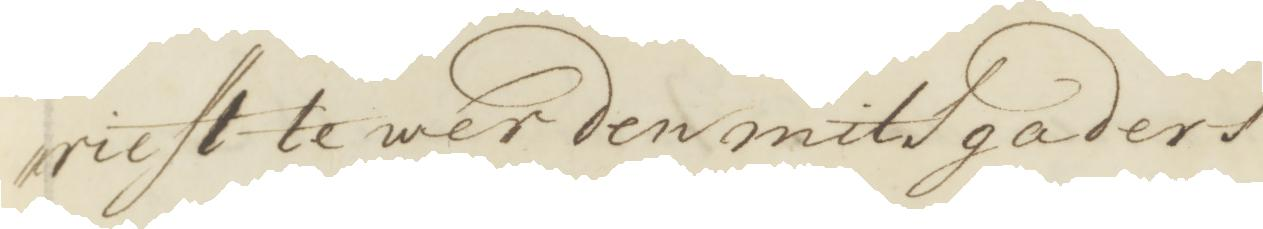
„rieft te werden mitsgaders
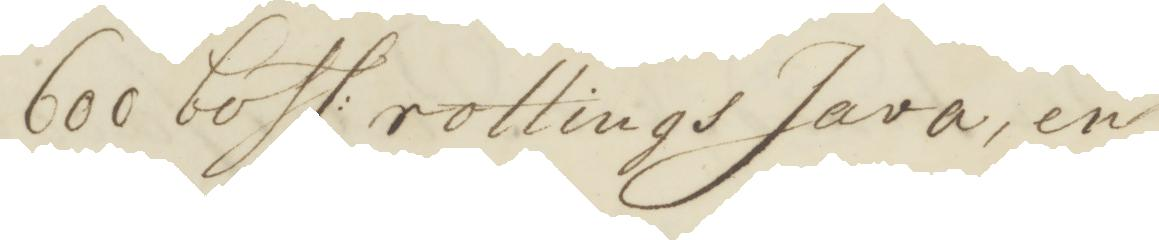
600 boss: rottings Java, en
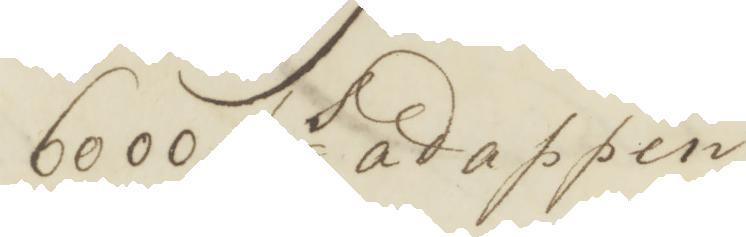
6000 p=s adappen
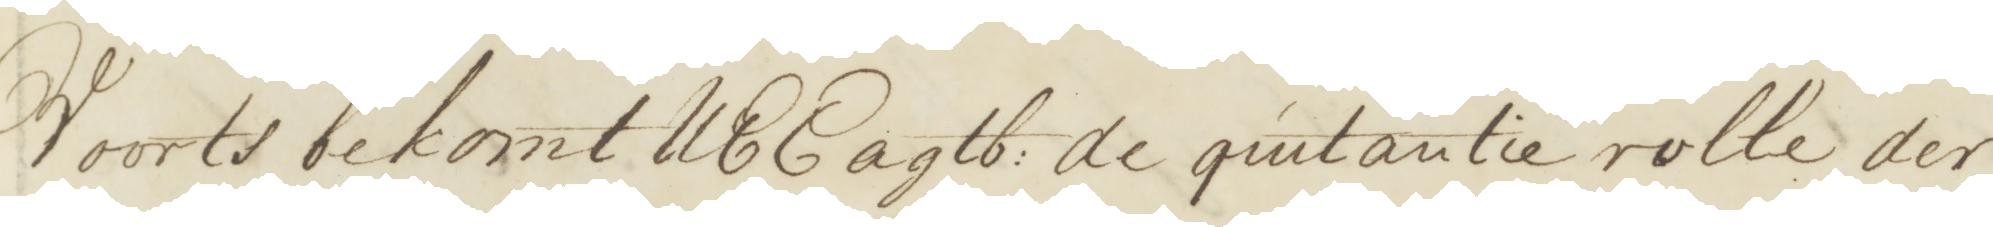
Voorts bekomt UEEagtb: de quitantie rolle der
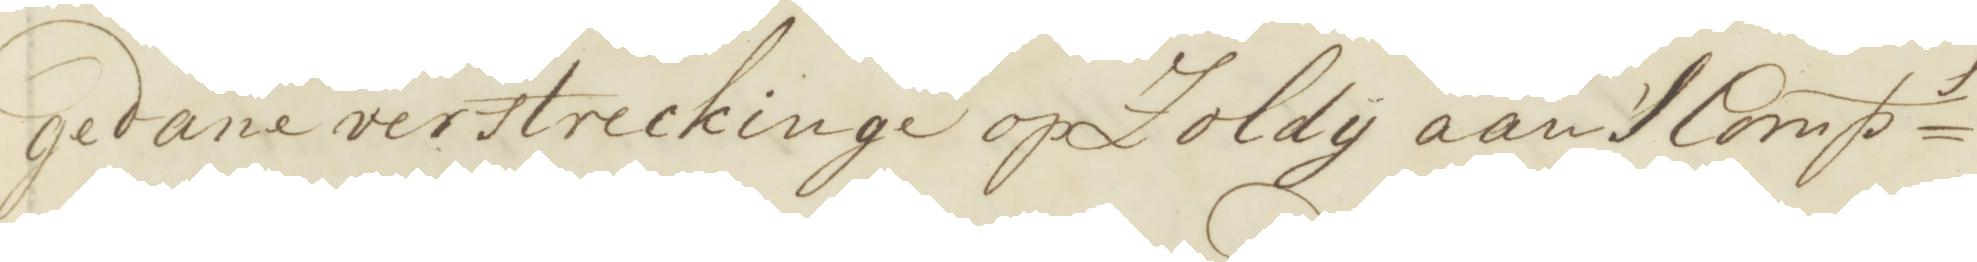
gedane verstreckinge op zoldij aan ’s Comp=s
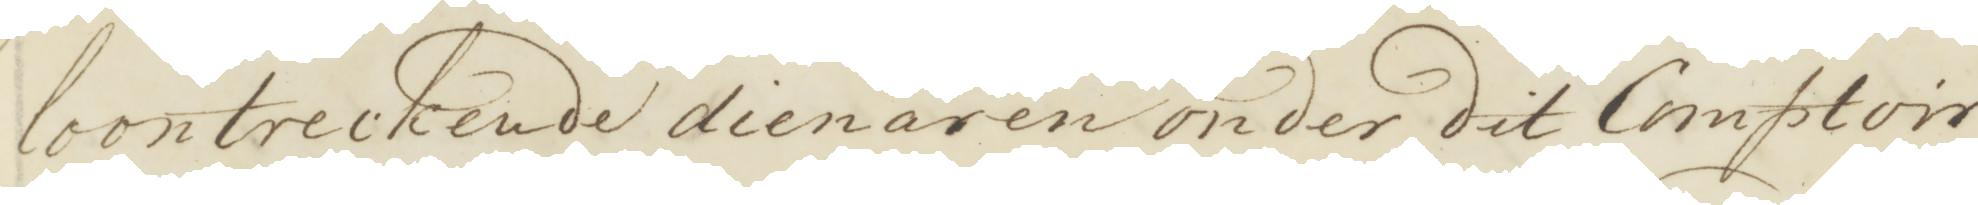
loontreckende dienaren onder dit Comptoir
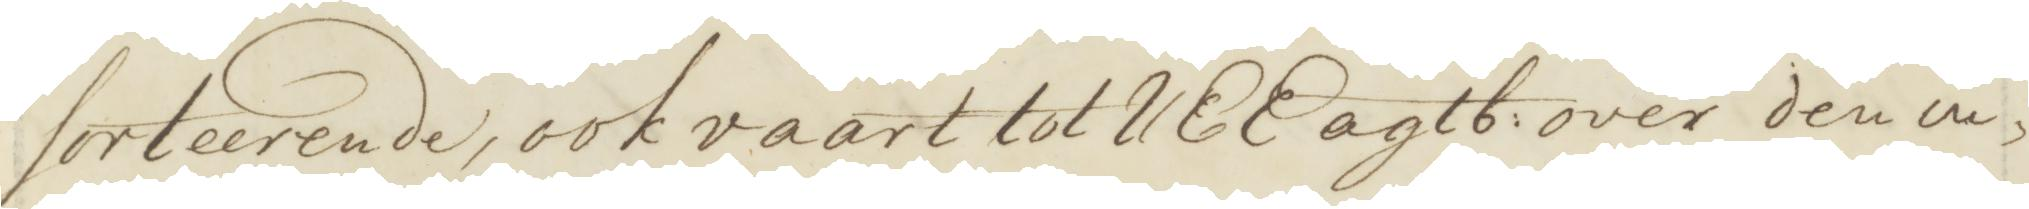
sorteerende, ook vaart tot UEEagtb: over den in„
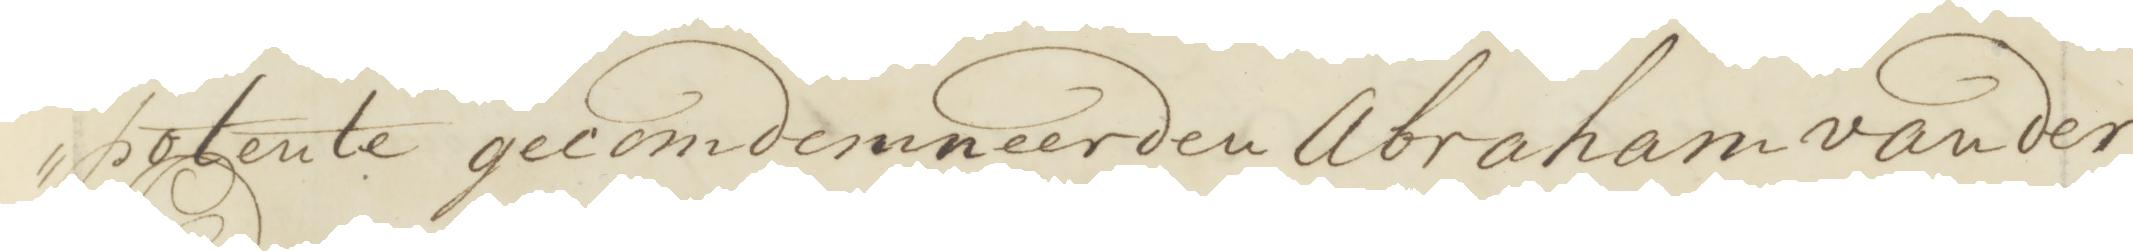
„potente gecomdemneerden Abraham van der
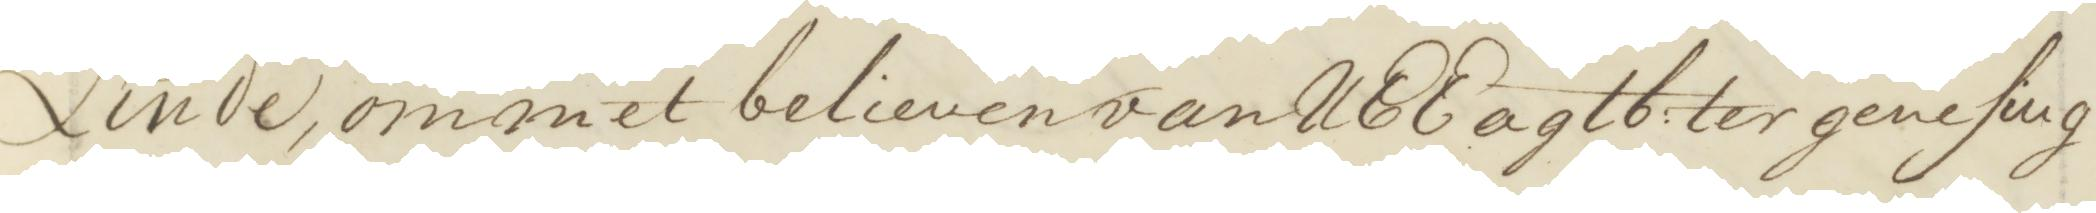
Linde, om met believen van UEEagtb: ter genesing
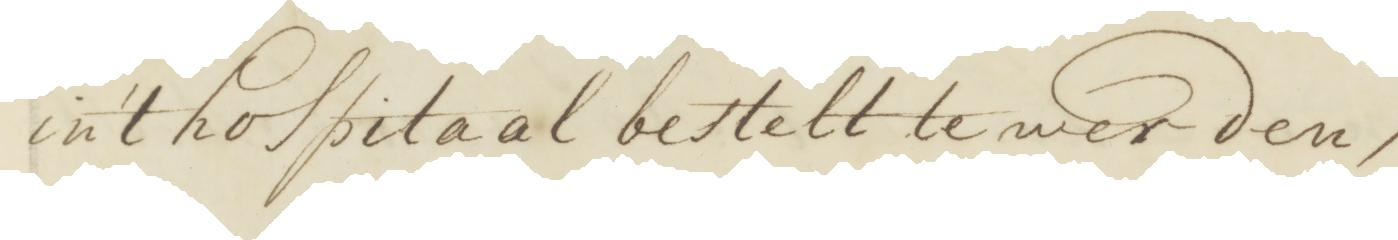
in ’t hospitaal bestelt te werden,
